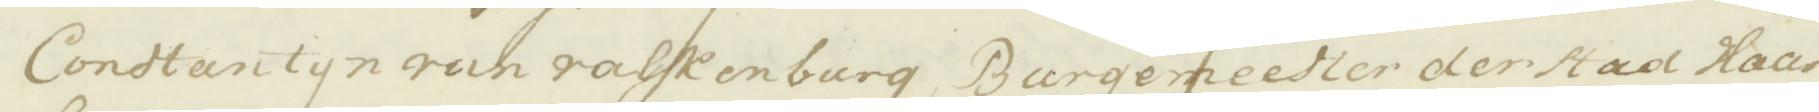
Constantijn van valkenburg, Burgemeester der stad Haar
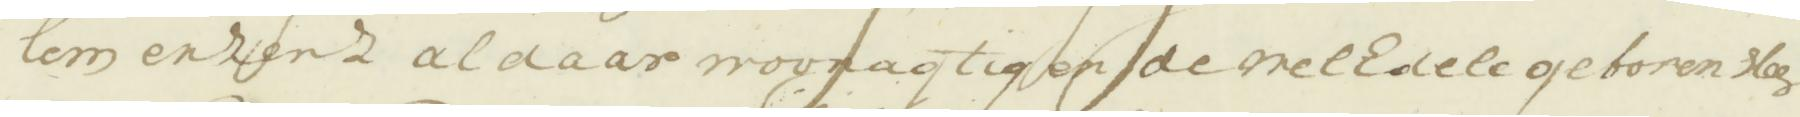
lem enz enz al daar woonagtig en de wel Edele geboren Heer
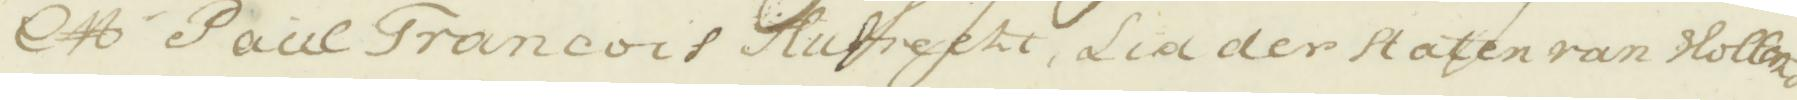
M Paul Francois Hubrecht, Lid der staten van Holland
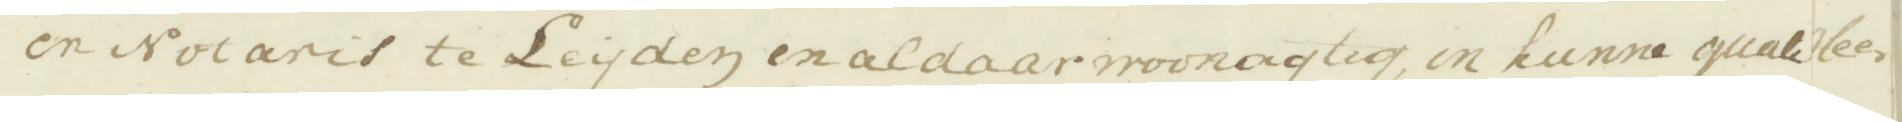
en Notaris te Leijden en aldaar woonagtig, in hunne quali
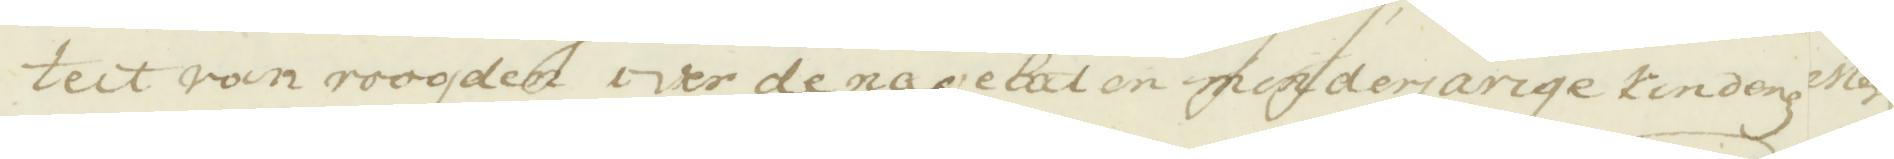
teit van voogden over de nagelaten minderjarige kinderen
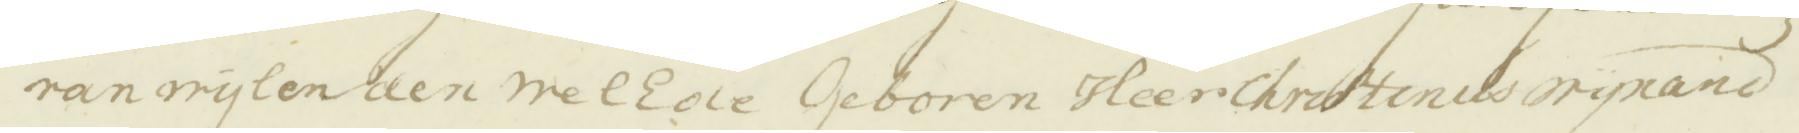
van wijlen den wel Ede Geboren Heer christinus wijnand
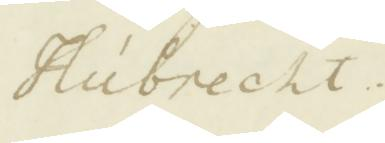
Hubrecht.
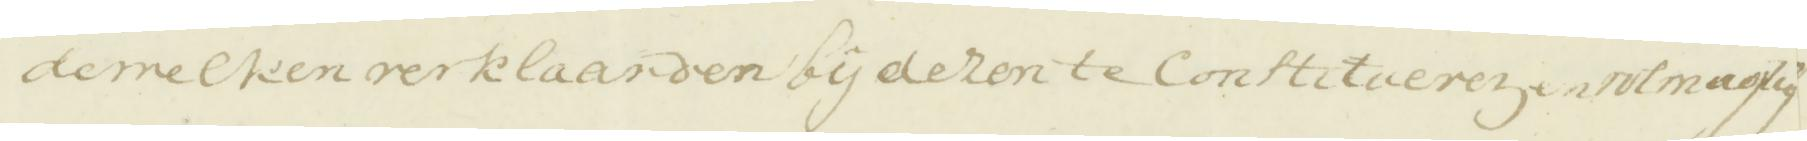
dewelken verklaarden bij dezen te constitueren en volmagtig
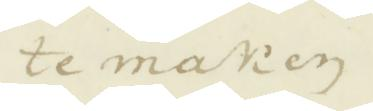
te maken
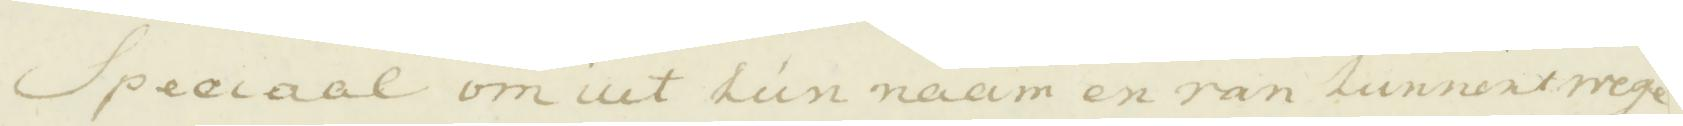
Speciaal om uit hun naam en van hunnentwege
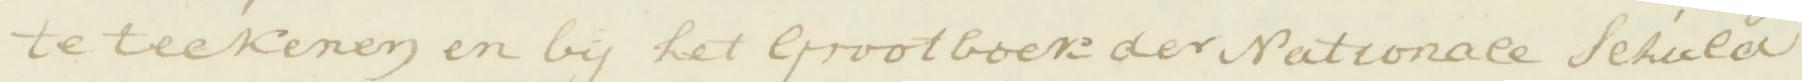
te teekenen en bij het Grootboek der Nationale Schuld
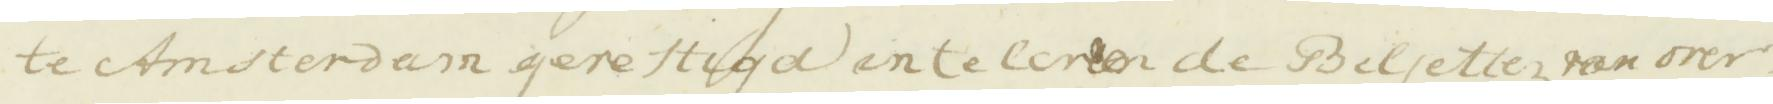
te Amsterdam gevestigd inteleveren de Biljetten van over:
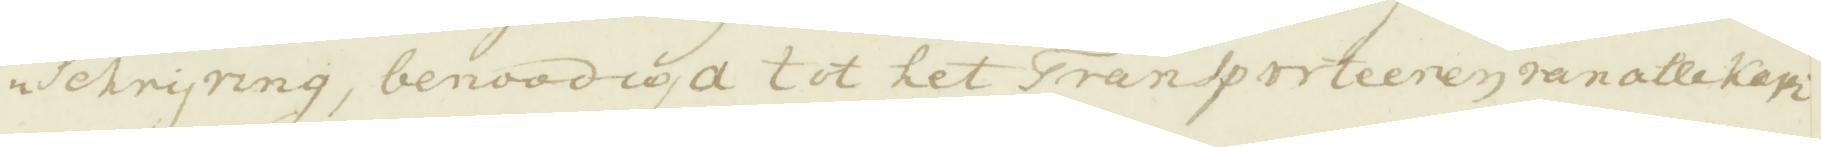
schrijving, benoodigd tot het Transporteeren van alle kapi
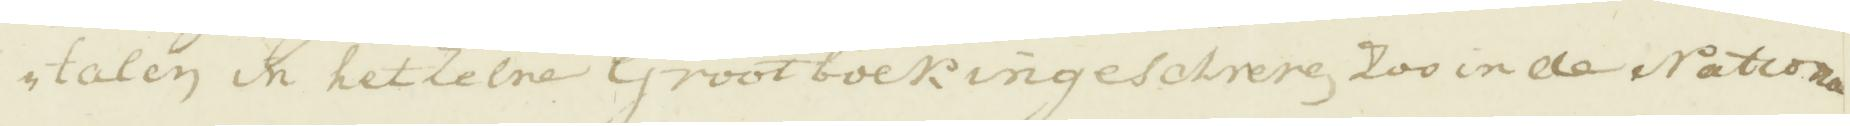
„talen in hetzelve Grootboek ingeschreven, zoo in de Nationale
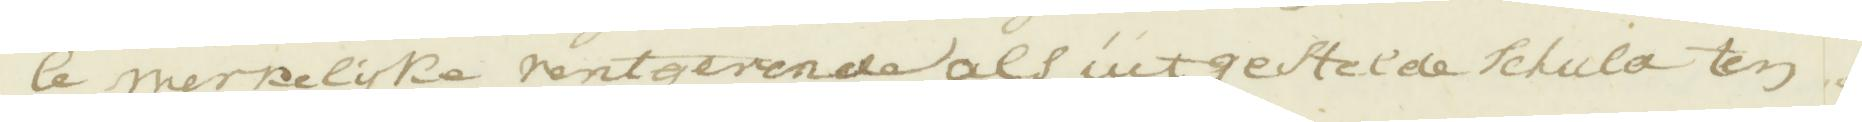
werkelijke rentgevende als uitgestelde schuld ten
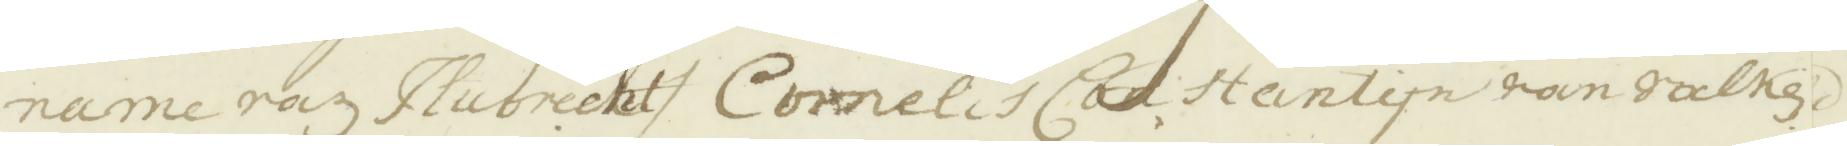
name van Hubrecht Cornelis Constantijn van valken
